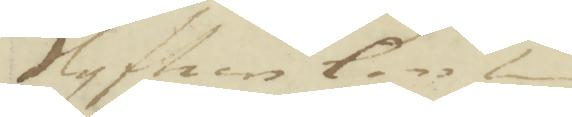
Vyftien Cent
